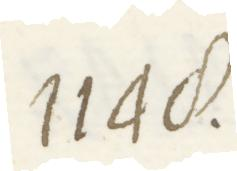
1148.
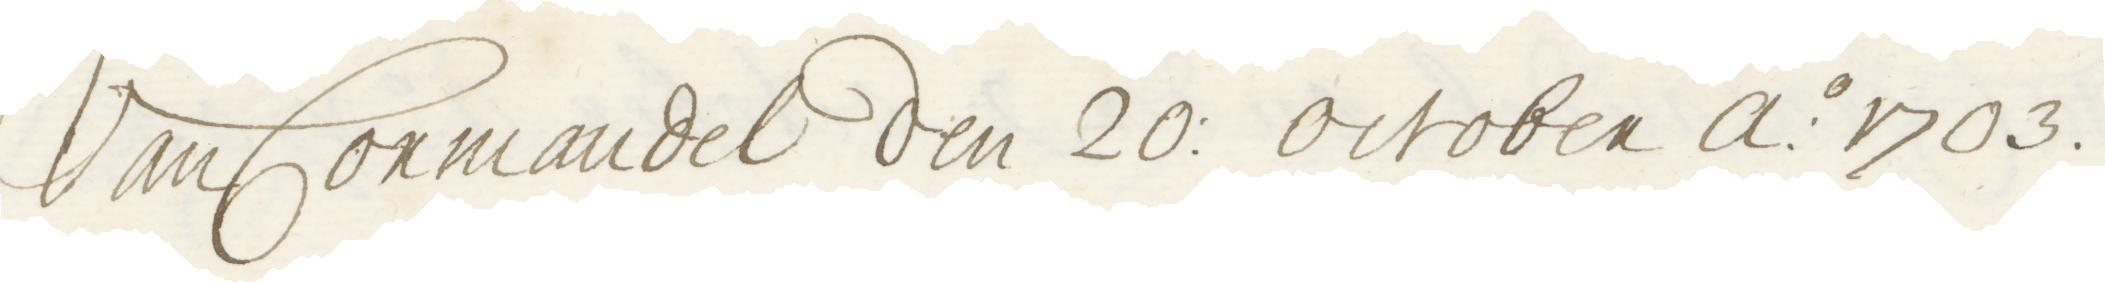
Van Cormandel den 20: October A:o 1703.
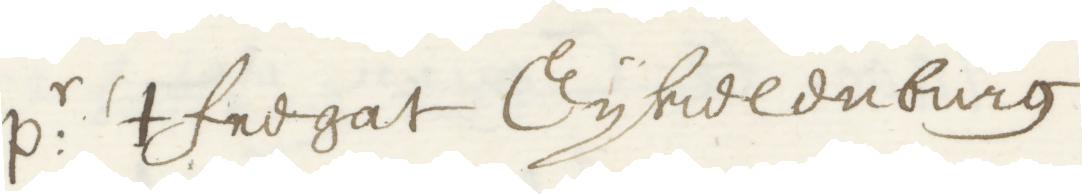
p:r 't fregat Eijkelenburg
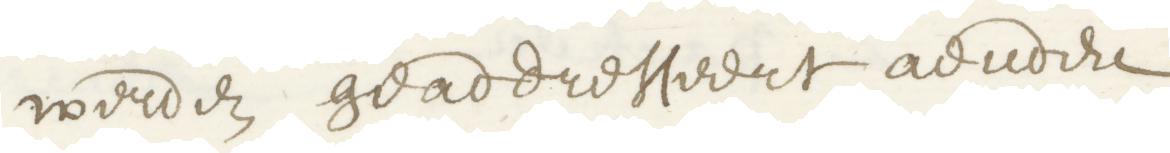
werden geaddresseert aenden
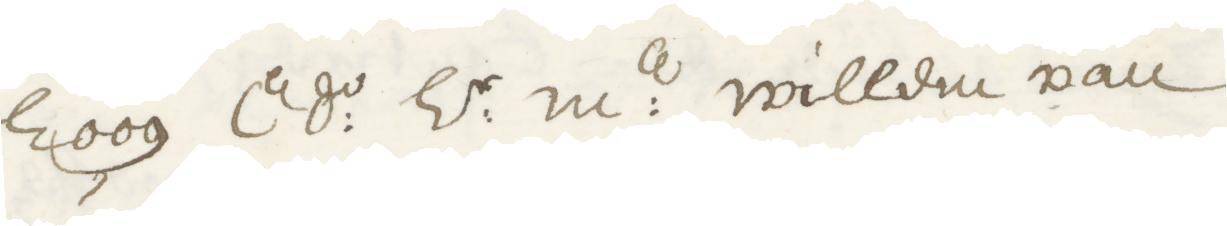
hoog Ed: h:r m:r willem van
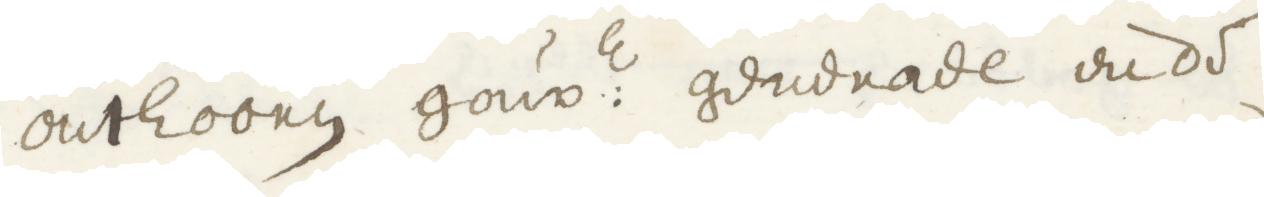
outhoorn gouv:r generael en de
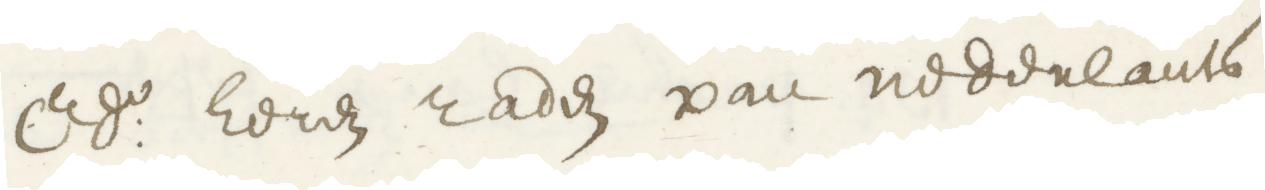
Ed: heren raden van nederlants
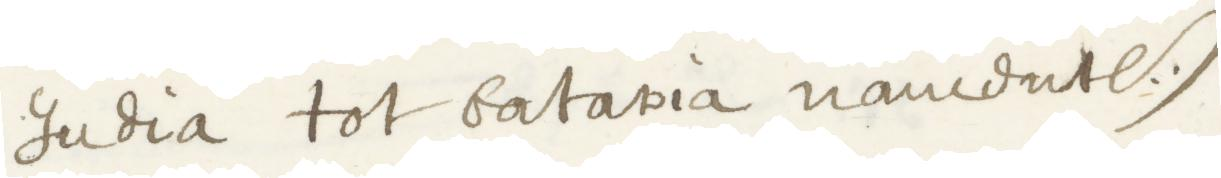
India tot batavia namentlijk
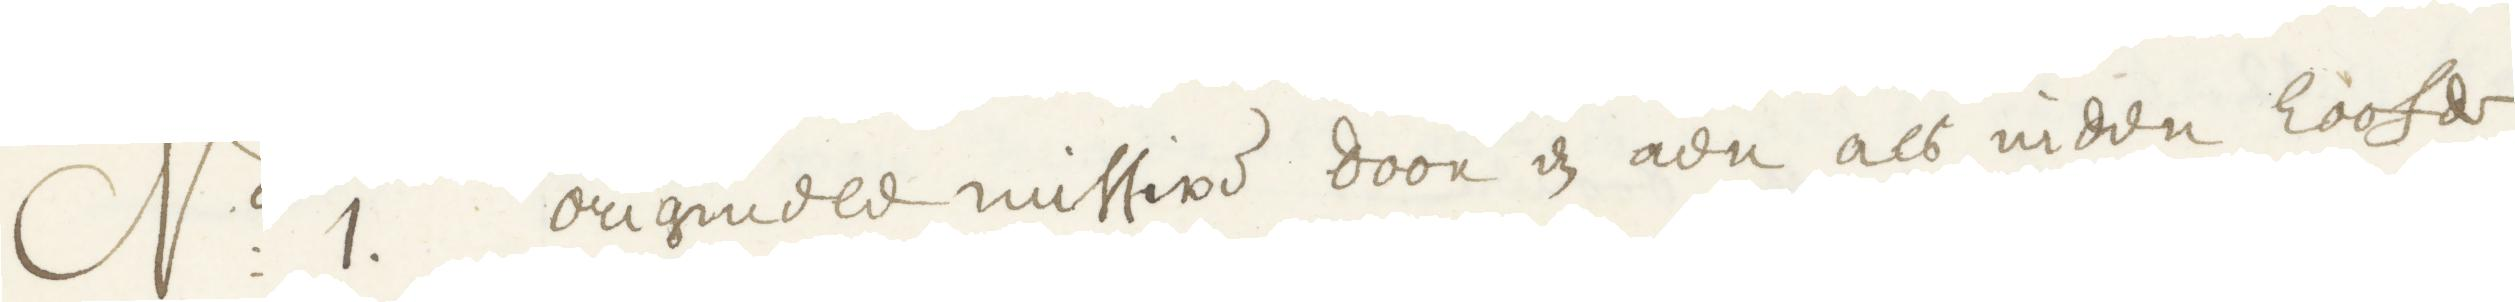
N:o 1. originele missive door en aen als in den hoofde
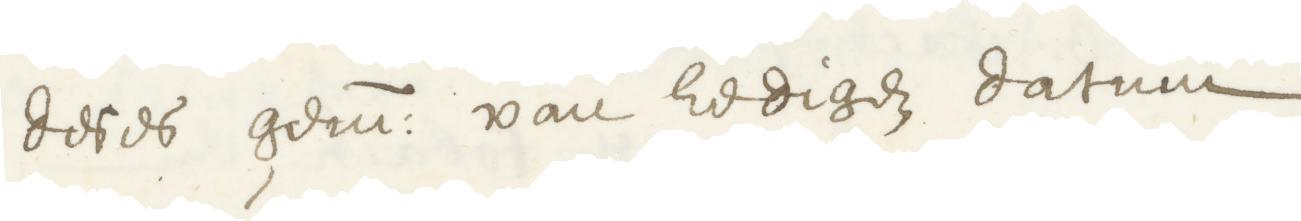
deses gem: van hedigen datum
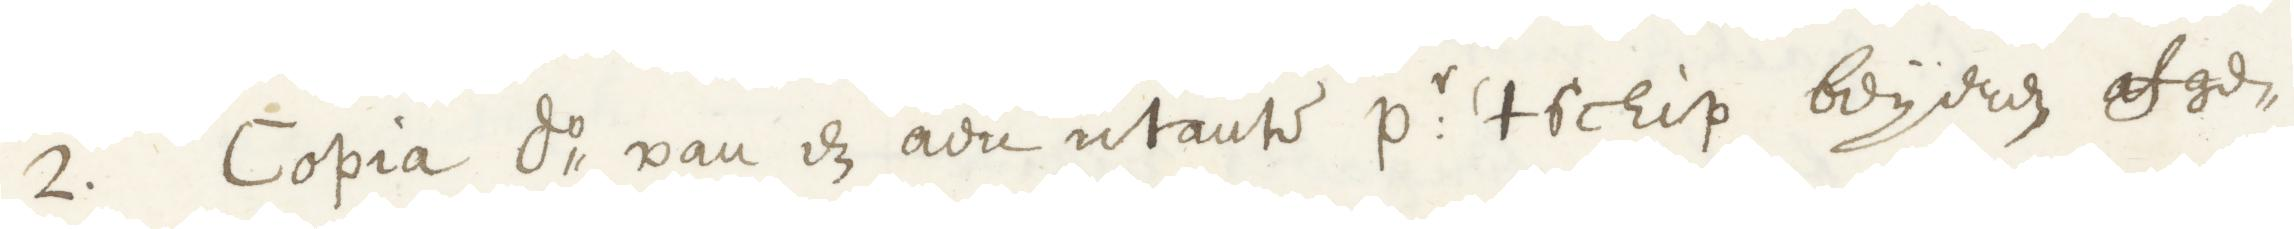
2. Copia d„o van en aen utante p:r ’t schip beijeren afge„
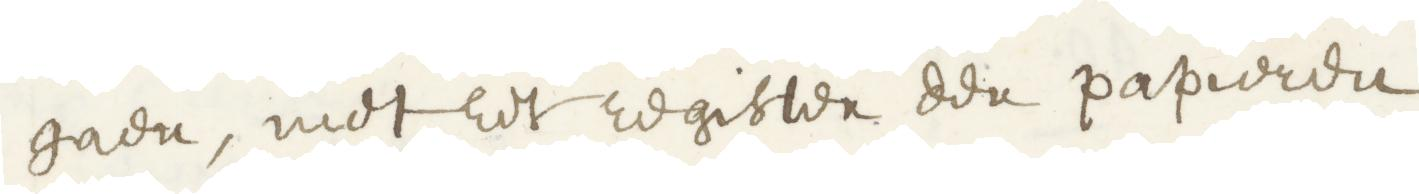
gaen, met het register der papieren
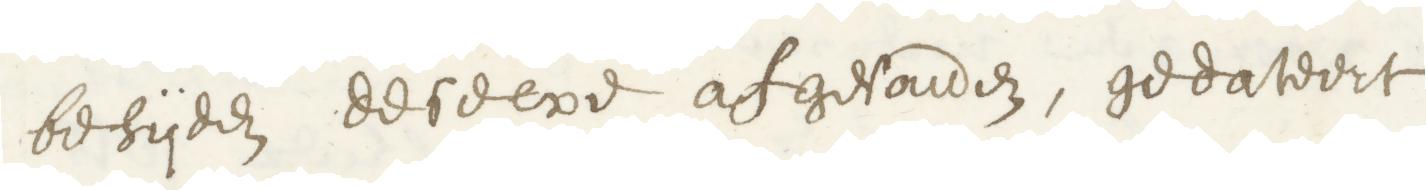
besijden deselve afgesonden, gedateert
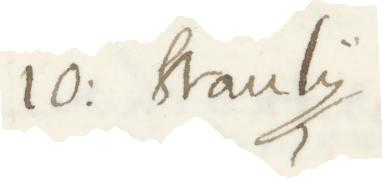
10: stantij
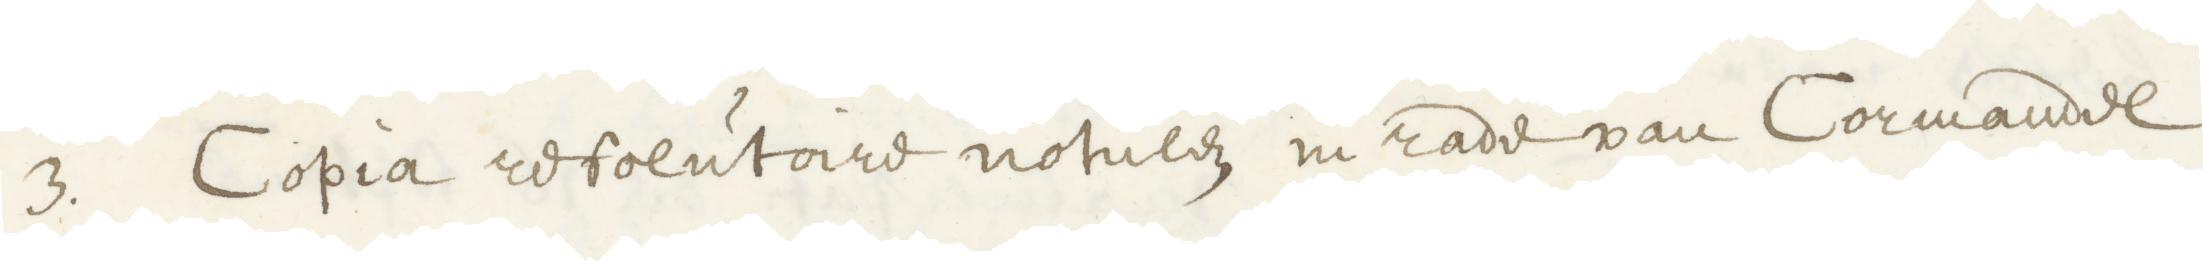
3. Copia resolutoire notulen in rade van Cormandel
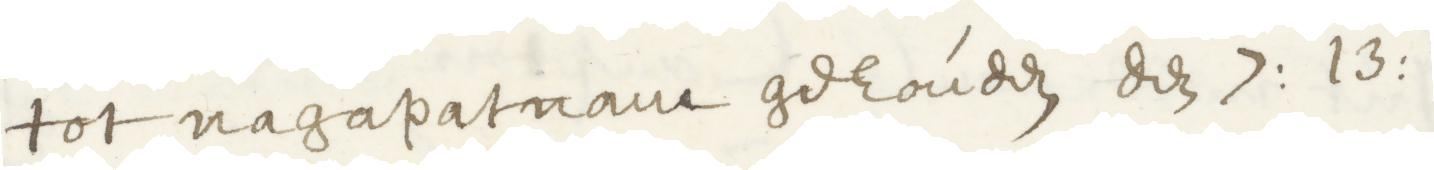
tot nagapatnam gehouden den 7: 13:
